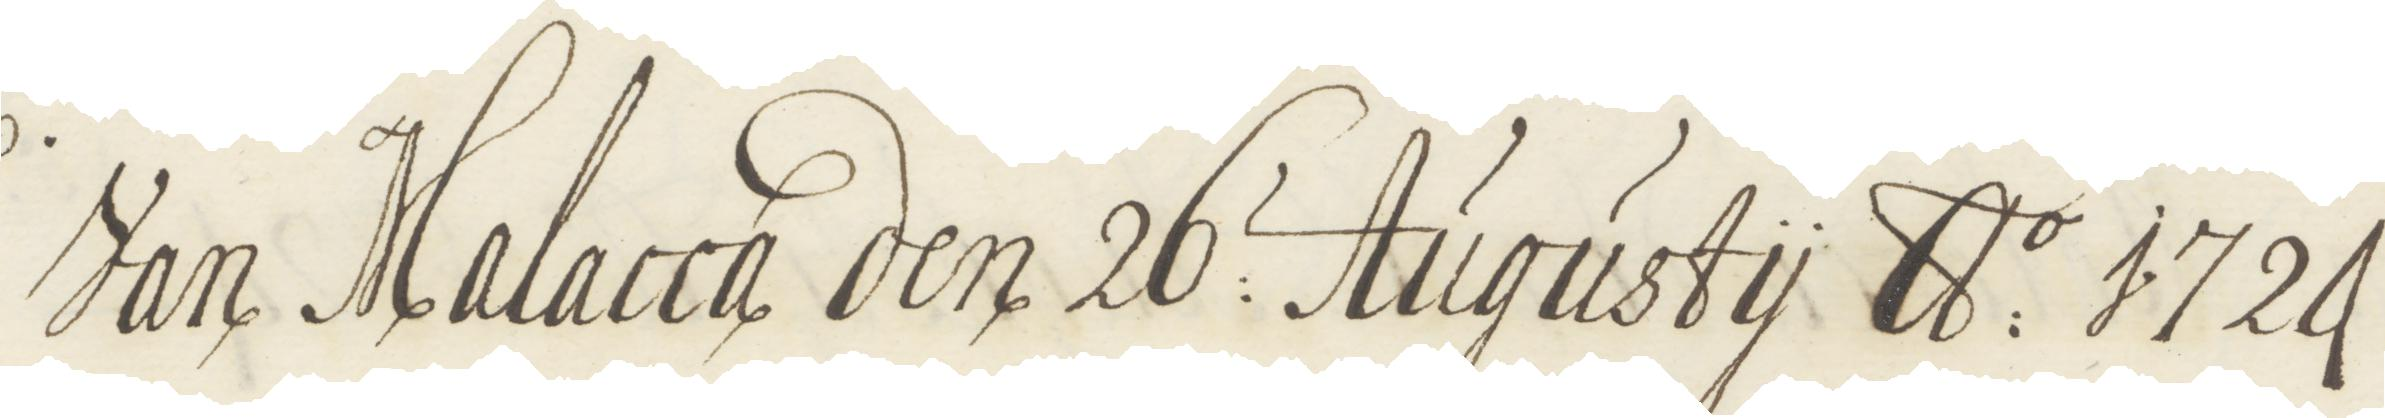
Van Malacca den 26:' Augustij A:o 1724.
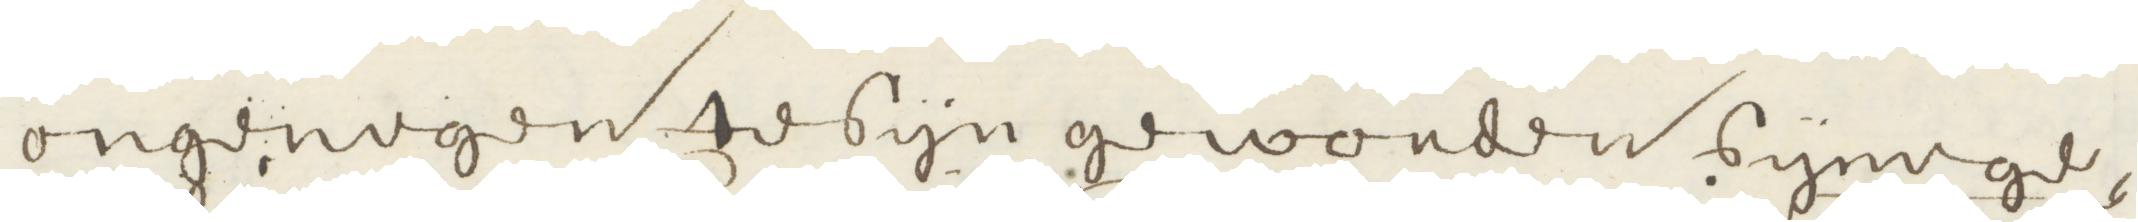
ongenegen te sijn geworden sijne ge„
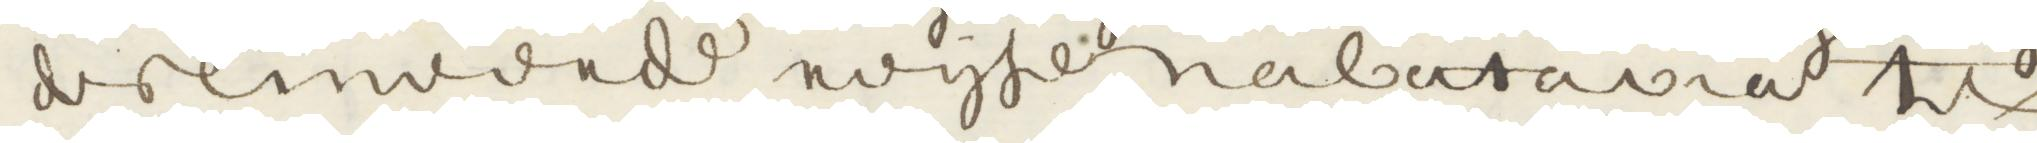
destineerde reijse na batavia te
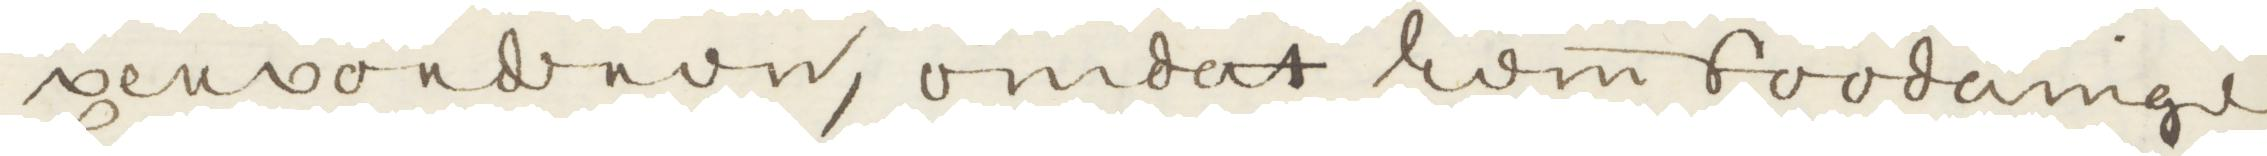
vervorderen, omdat hem soodanige
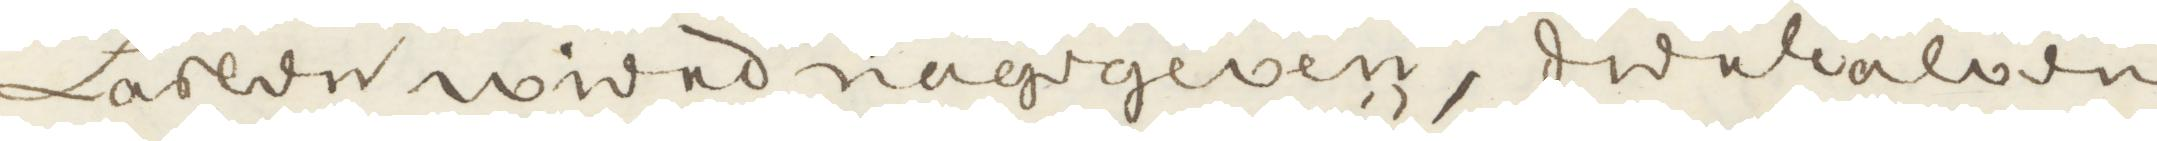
lasten wierd nagegeven, dierhalven
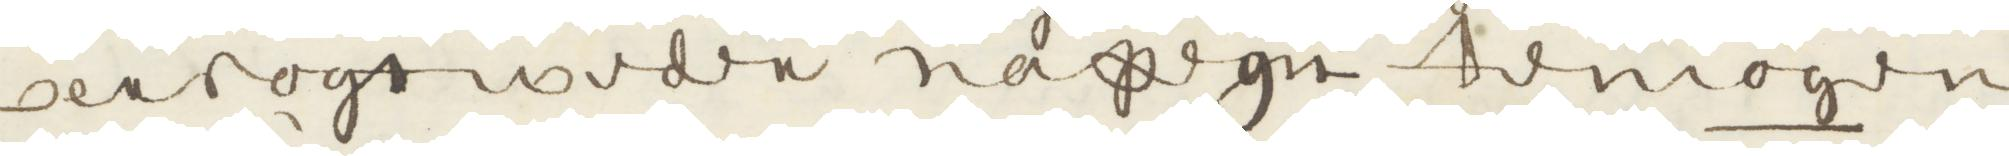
versogt weder na pegu te mogen
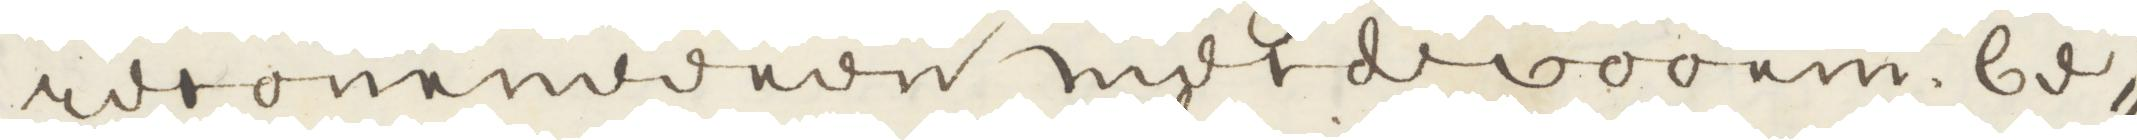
retourneeren met de voorm. be„
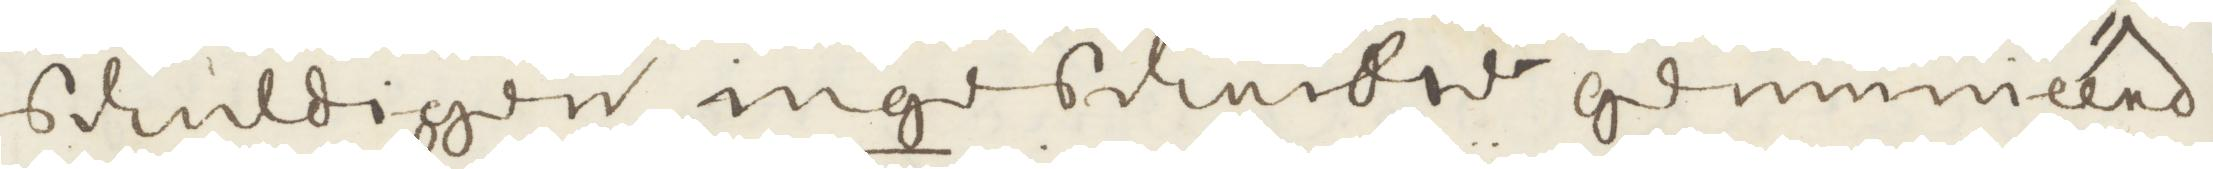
schuldigen ingeschrifte gemunieerd
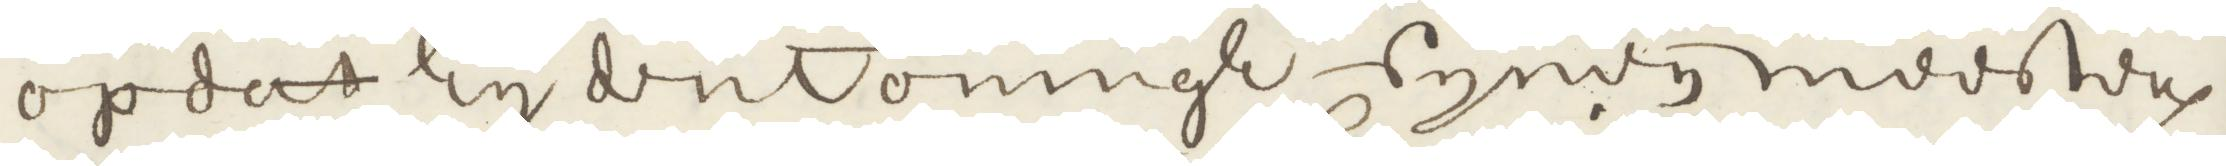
opdat hij den Coningh sijnen meester
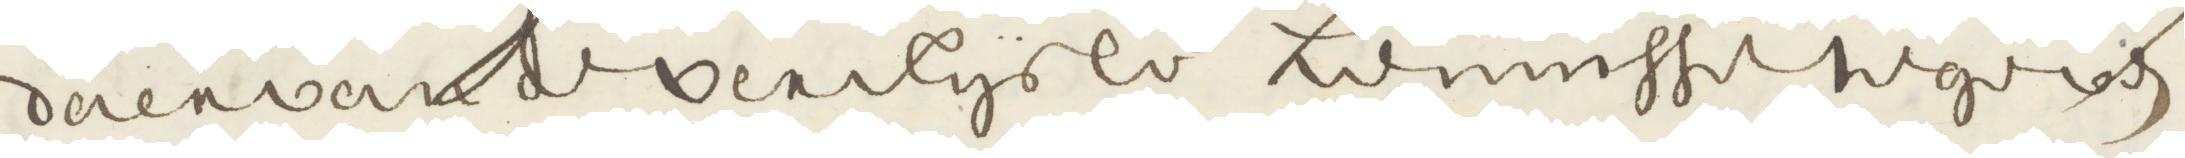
daervan de verEijste kennisse te geven
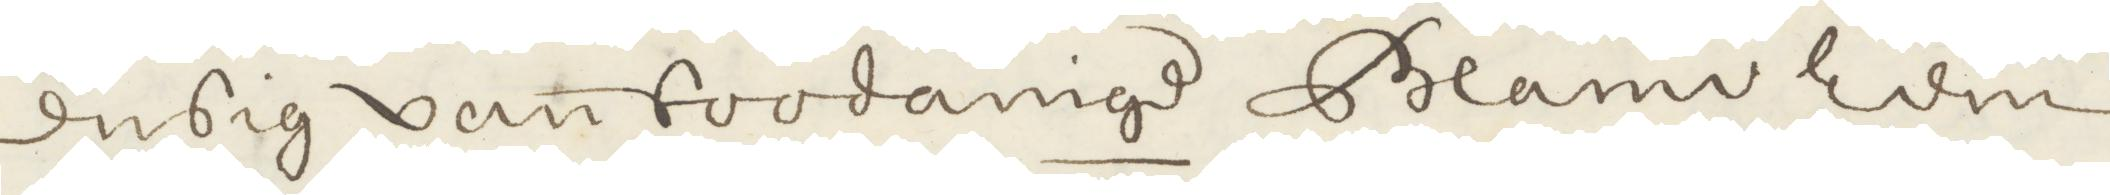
en sig van soodanige Blame hem
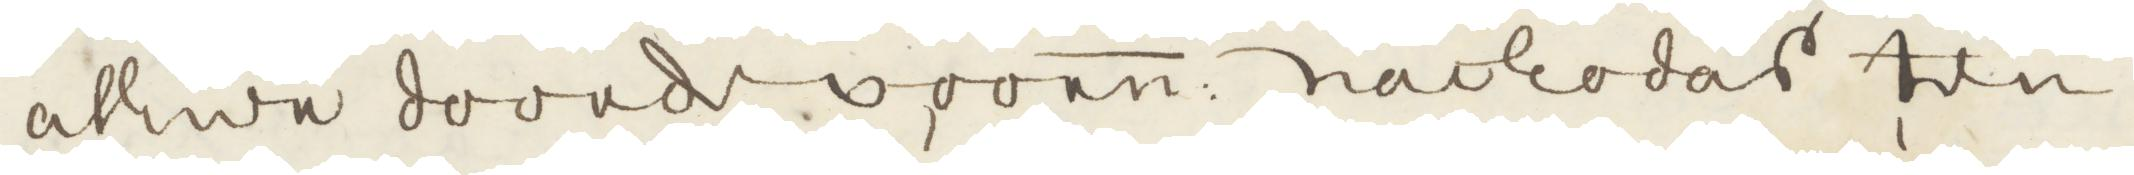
alhier door de voorn: nachodas ten
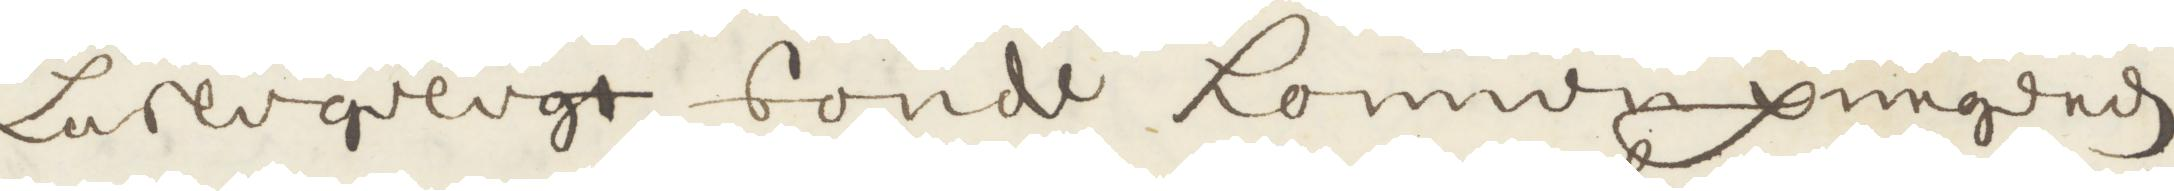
laste gelegt soude konnen purgeren
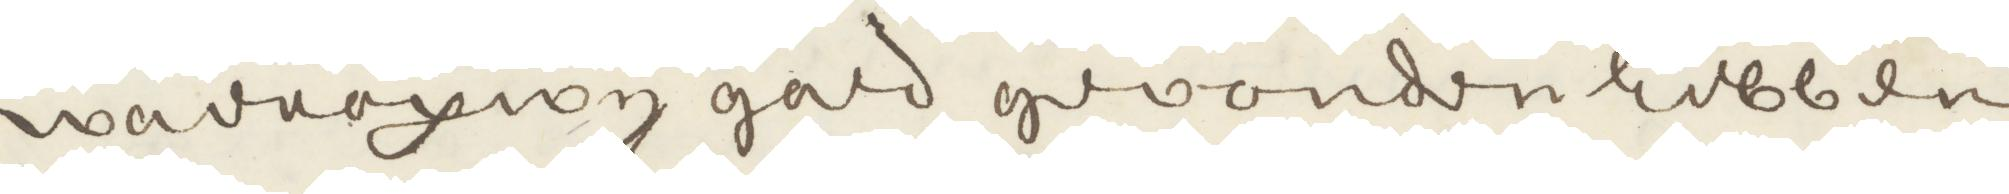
waerop wij goed gevonden hebben
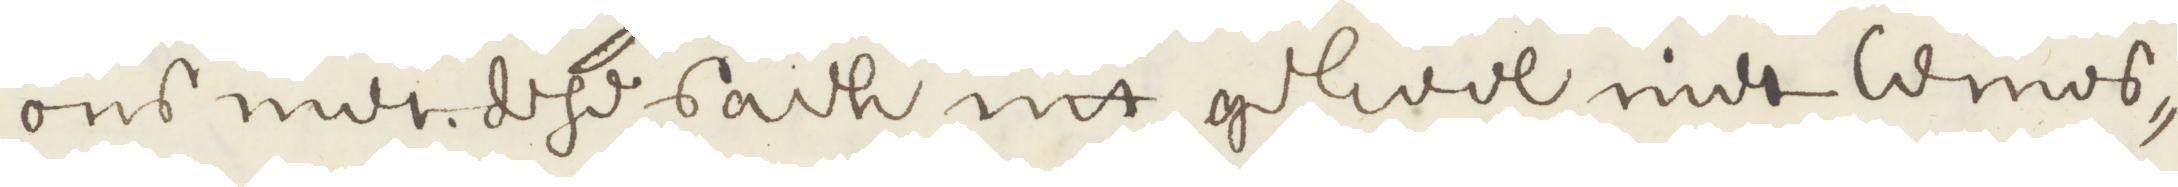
ons met dese saek in't geheel niet te mes„
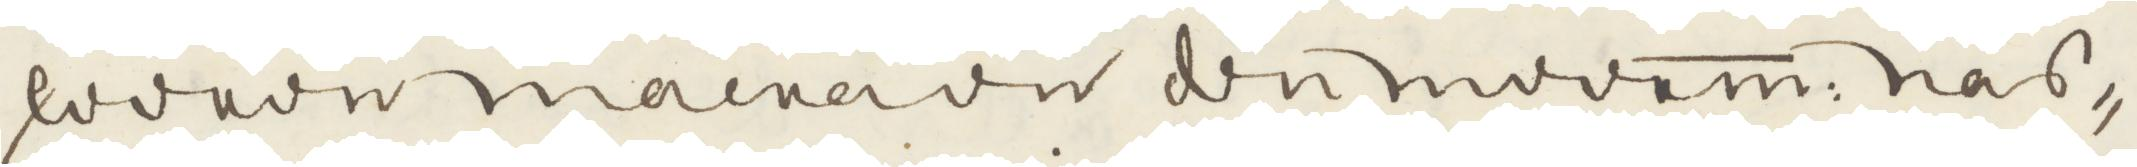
leeren maer aen den meerm: nas„
